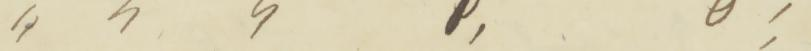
„ „ „ d:o d:o
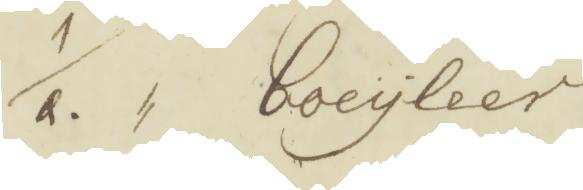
¼. „ boeijleer
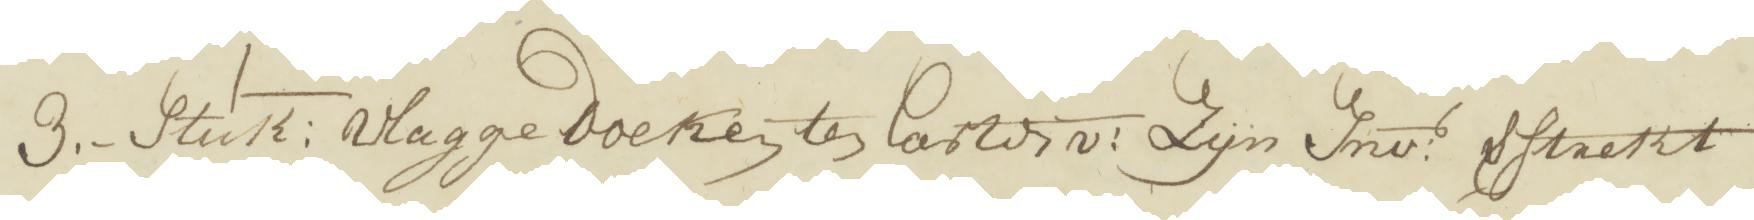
3.– Stuk: Vlagge doeken ten lasten v: zijn Inv:s verstrekt
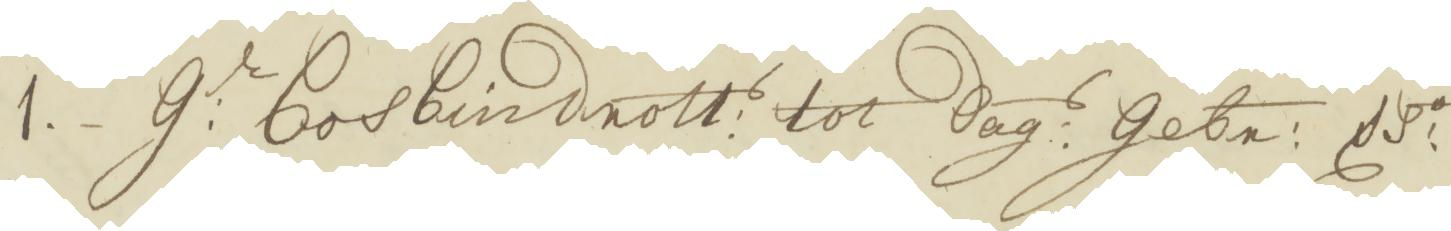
1.– g:r bosbindrott:s tot dag:s gebr: vers:t
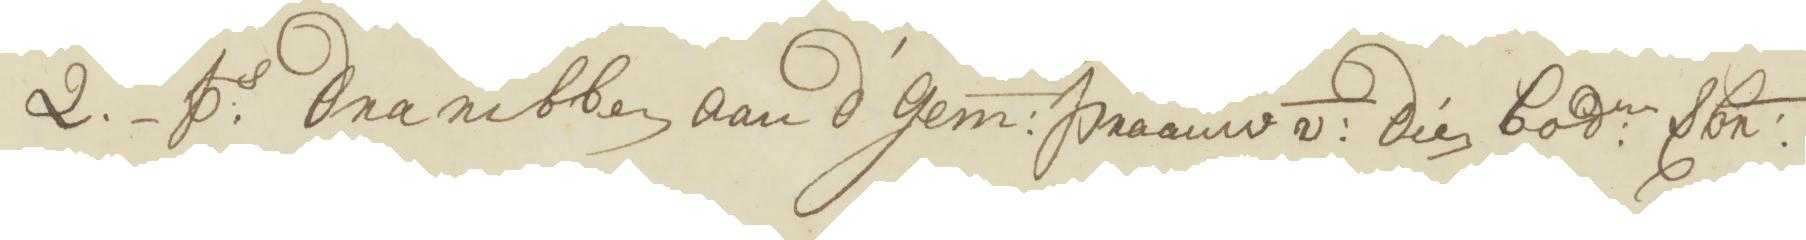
2.– p:s dra ribben aan d’ gem: praauw v: dien bod:m verbr:
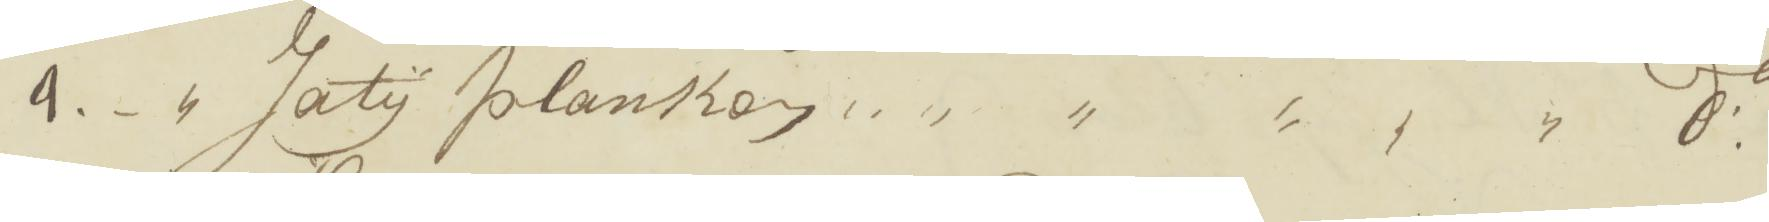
4.– „ Jatij planken „ „ „ „ „ „ d:o
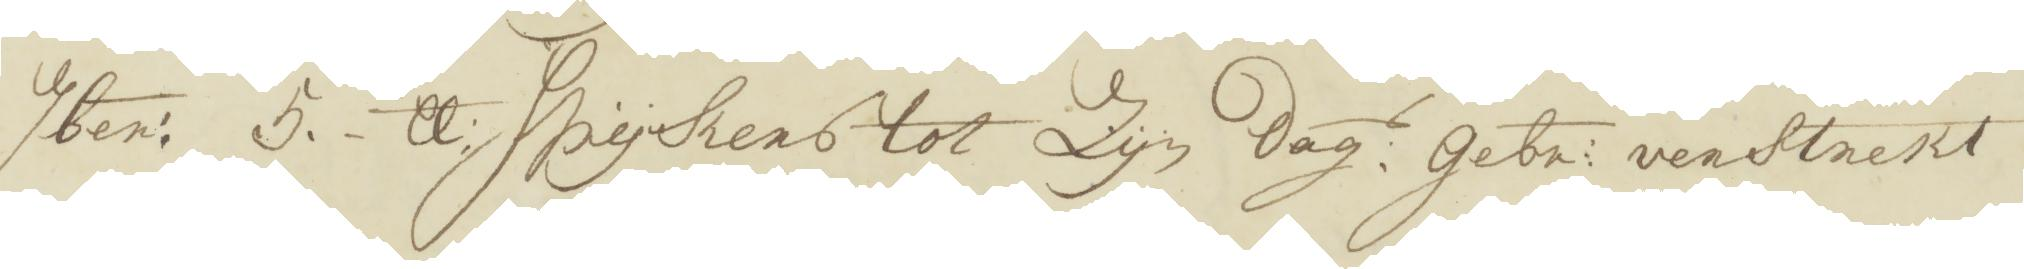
7ber: 5.– lb: spijkers tot zijn dag:s gebr: verstrekt
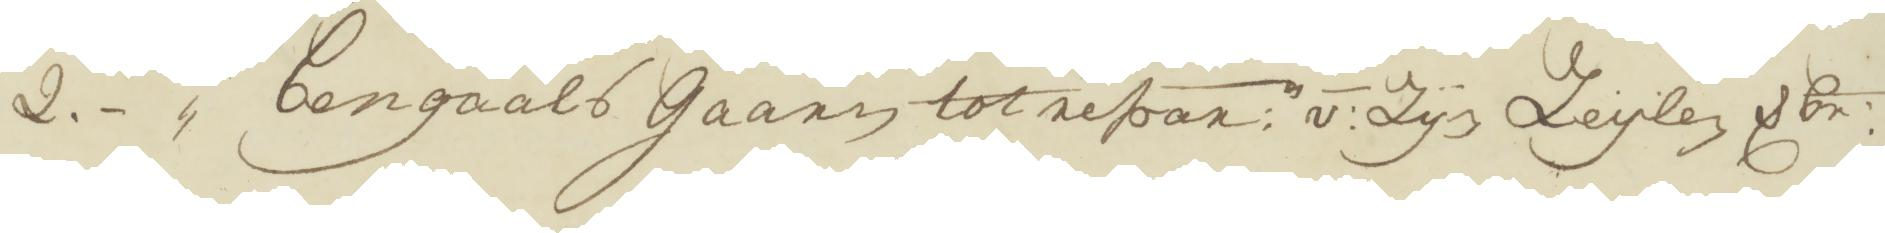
2.– „ bengaals gaarn tot repar:n v: zijn zeijlen verbr:
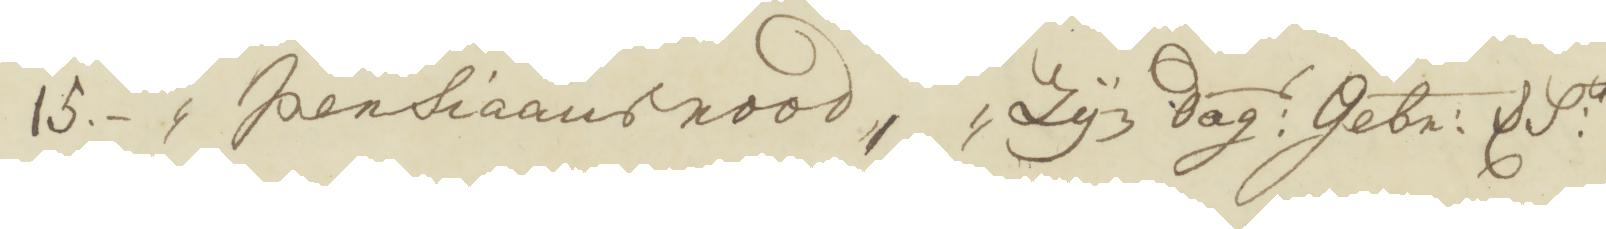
15.– „ persiaans rood„ „zijn dag:s gebr: vers:tt
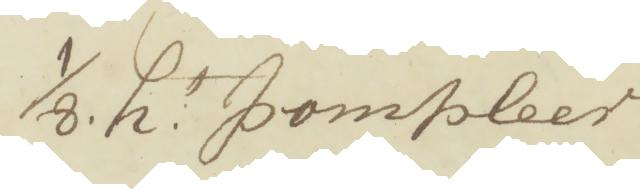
1/8. h:t pompleer
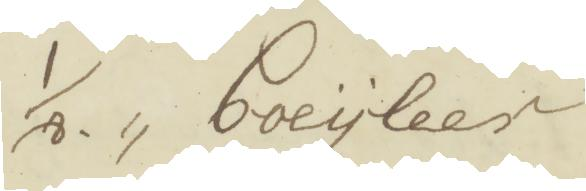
1/8. „ boeijleer
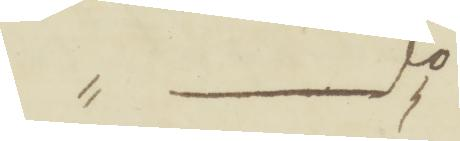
„ „ _„o
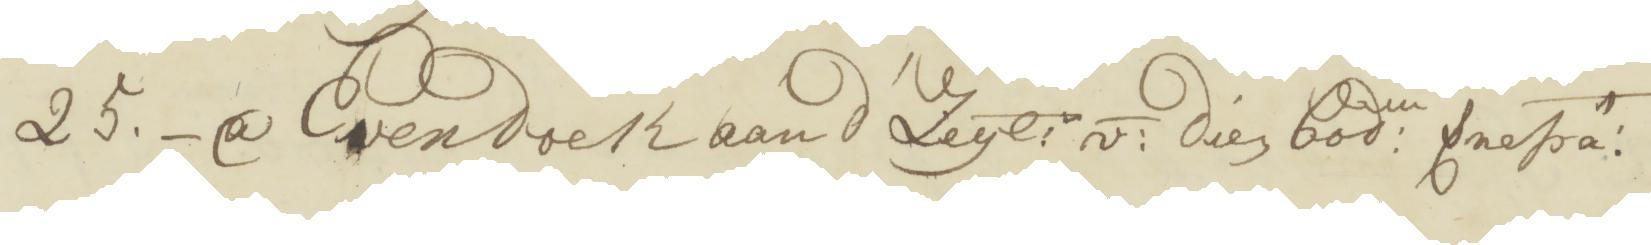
25. – @ Everdoek aan d’ Zeijl:s v: dien bod:m verrepa:t
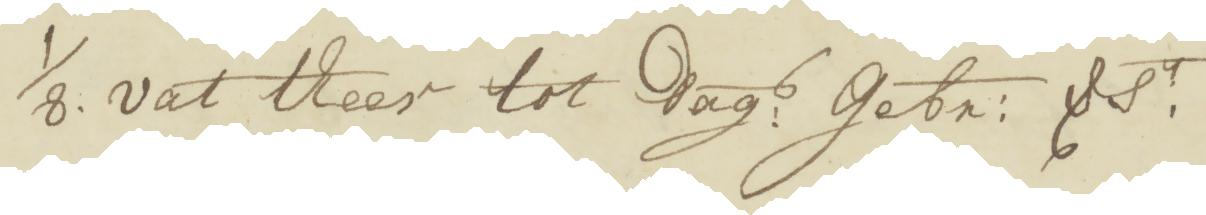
1/8. vat theer tot dag:s gebr: vers:t
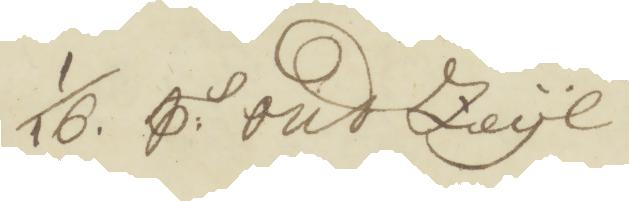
1/16. p:s oud Zeijl
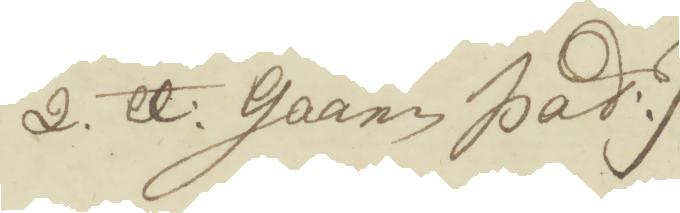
½. lb: gaarn pad:s
